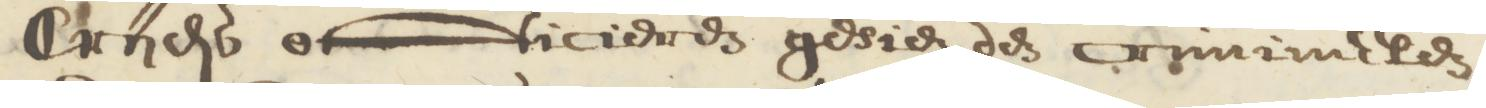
Crijchs officieren gesien den crimineelen
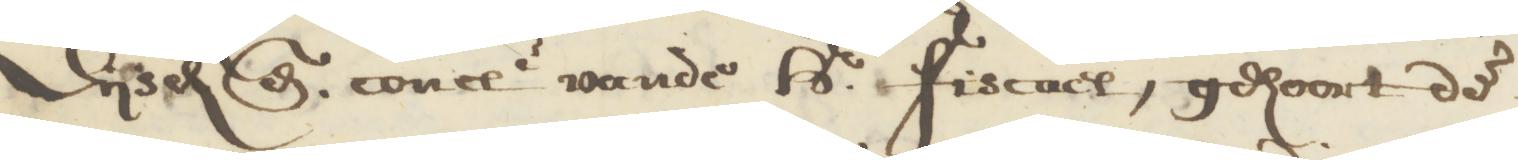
Eijsch ende concl=e vande H.r Fiscael, gehoort de —
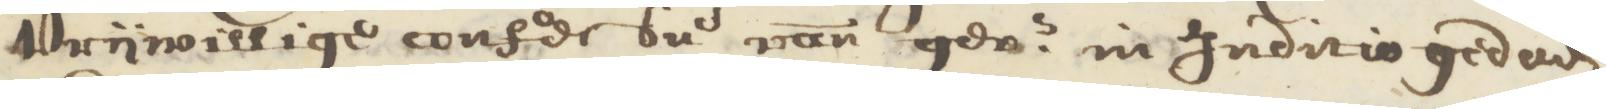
Vrijwillige confessie van gev:s in Jnditio gedaen
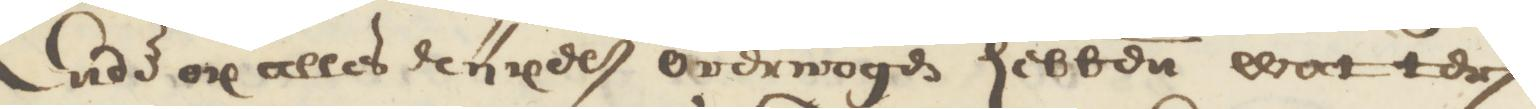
Ende op alles rijpelijk overwogen hebben wat ter
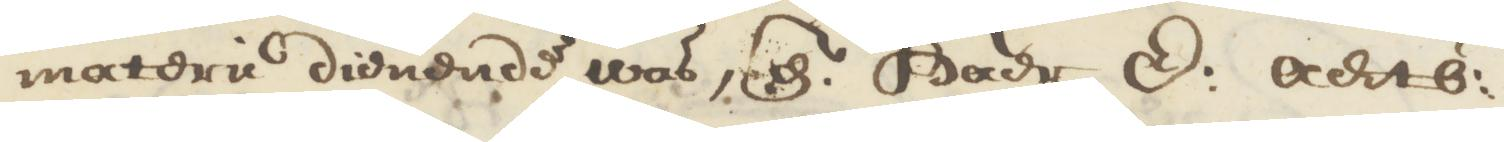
materie dienende was, ende Haer E: achtb:
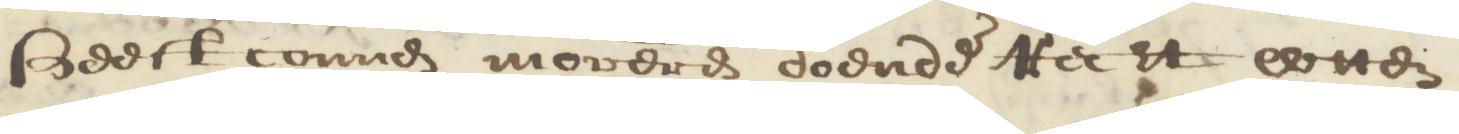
Heeft connen moveren doende Recht wtten
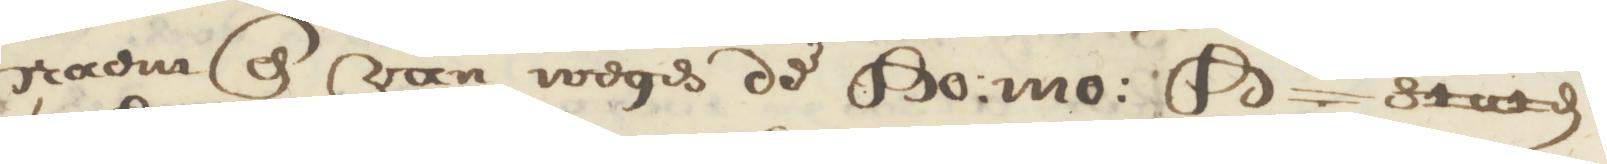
Naem ende van wegen de Ho:mo: H=ren staten
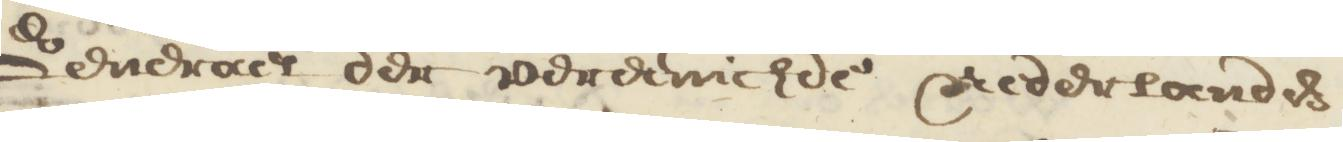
Generael der vereenichde nederlanden
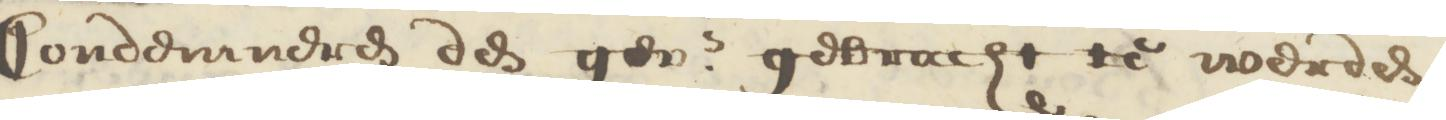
Condemneren den gev:s gebracht te werden
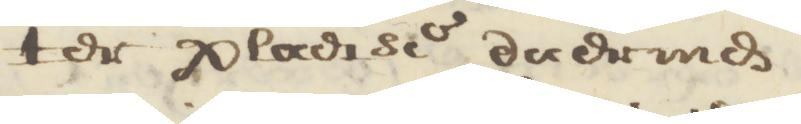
ter plaetse daermen Gewoon is
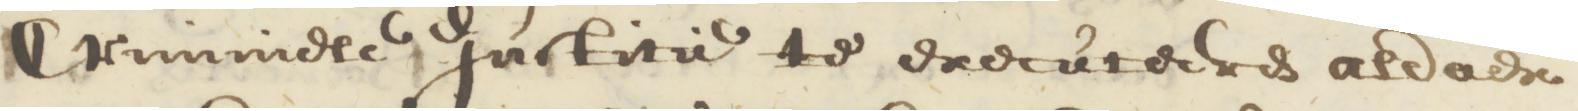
Criminele Justitie te executeeren aldaer
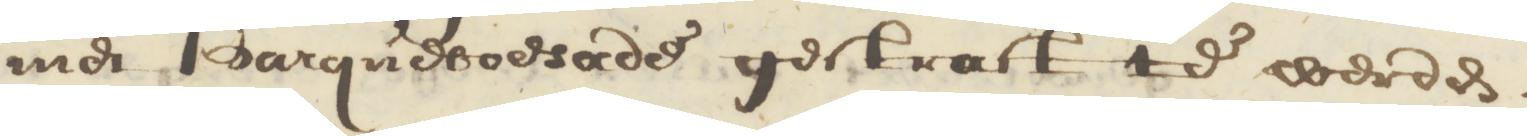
met Harqueboesade gestraft te werden
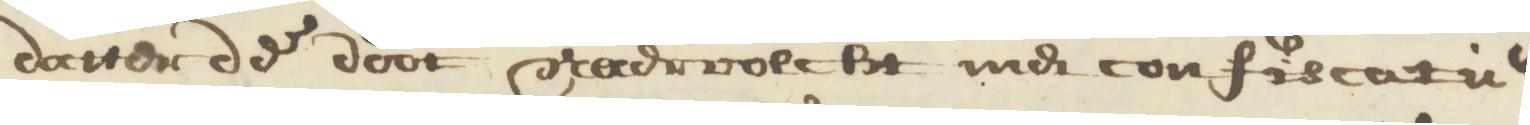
datter de doot naervolcht met confiscatie
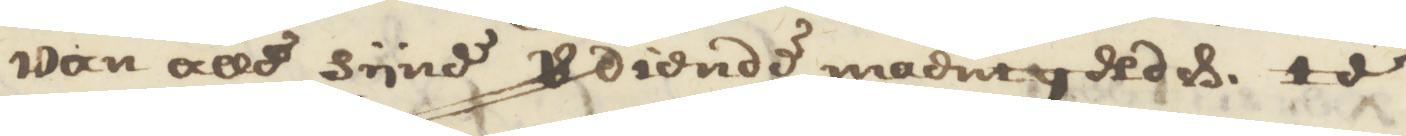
van alle sijne verdiende maentgelden. te
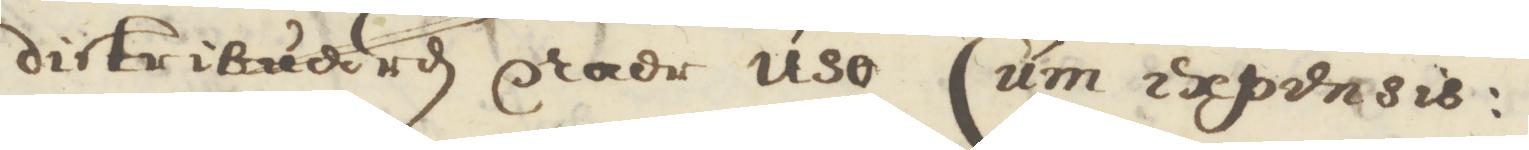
distribueeren naer uso Cum expensis:
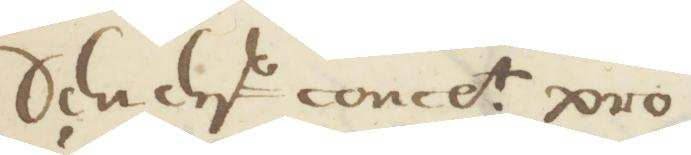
Den Ey=r concl:t pro
